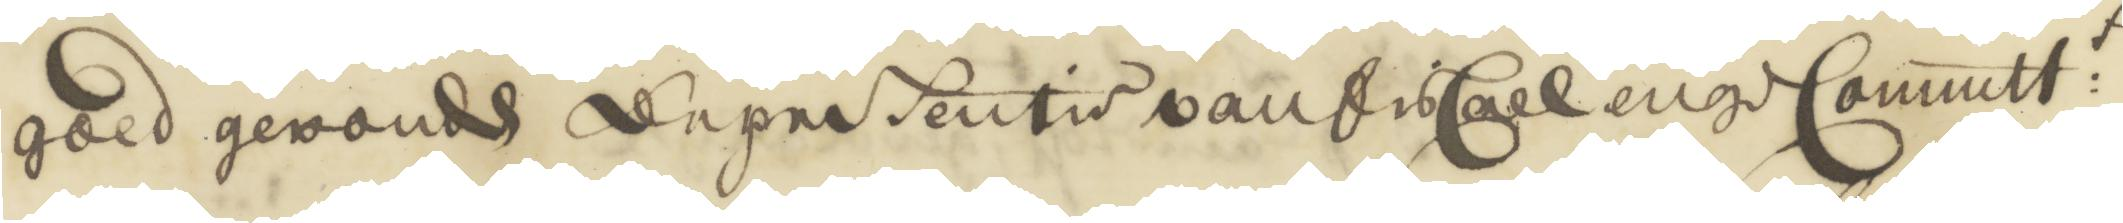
goed gevonden terpresentie van fiscael en geconmitt:s
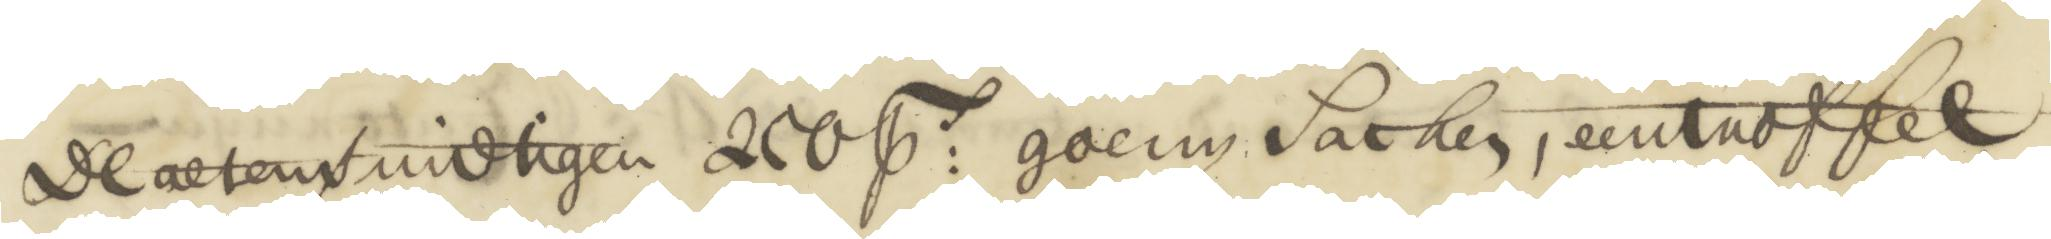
te laeten vernietigen 250 p:s goeny Sacken, een troffel
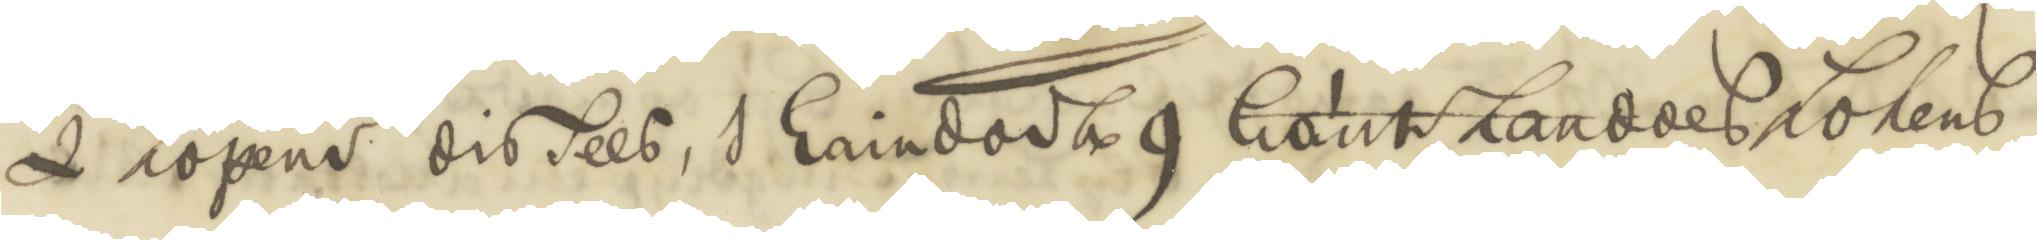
2 kopere dissels, 1 hairdoek 9 houte kardoes Lokers
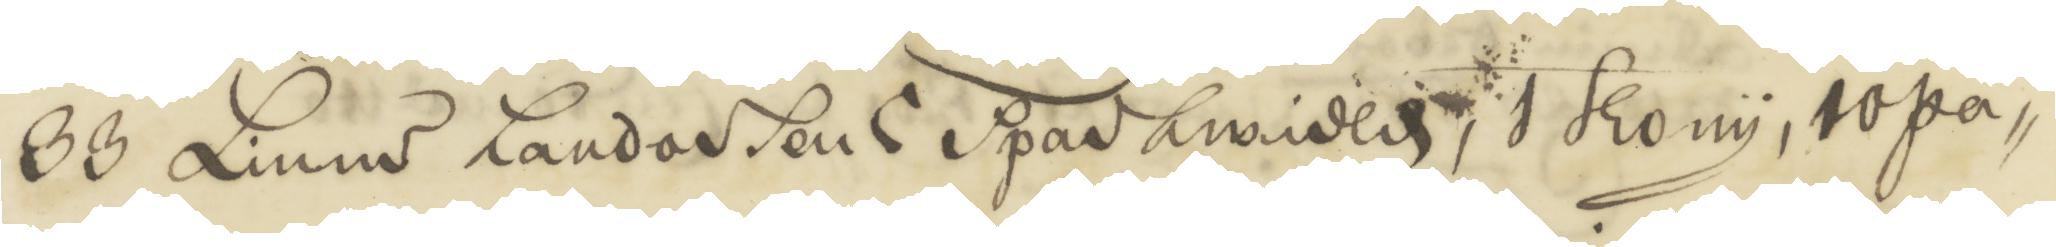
33 Linne kardoesen 5 Spaekwielen, 1 Thonij, 10 pa„
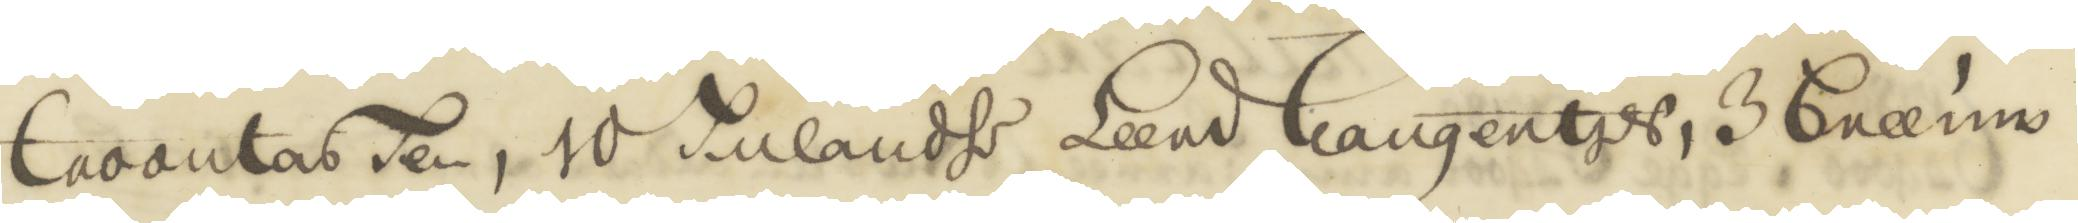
troontassen, 10 Inlandse Leere hangertjes, 3 breeuw
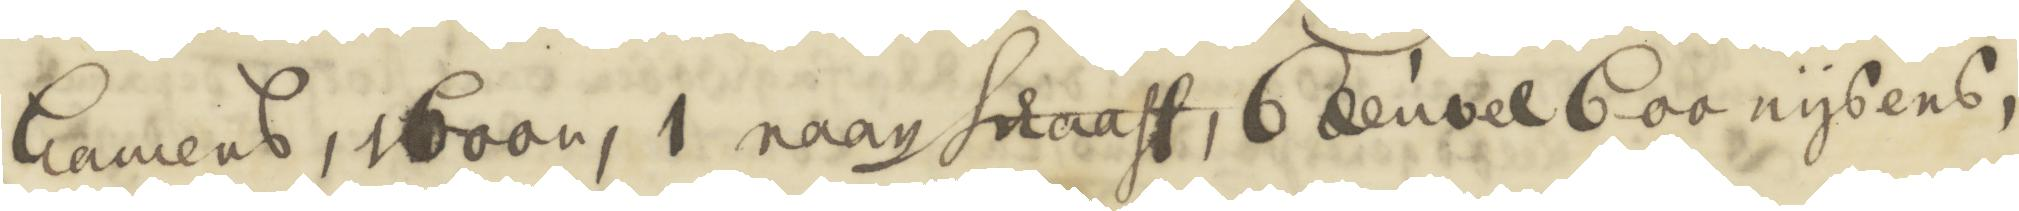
kamers, 1 boor, 1 raay schaaff, 6 deuvel boorijsers,
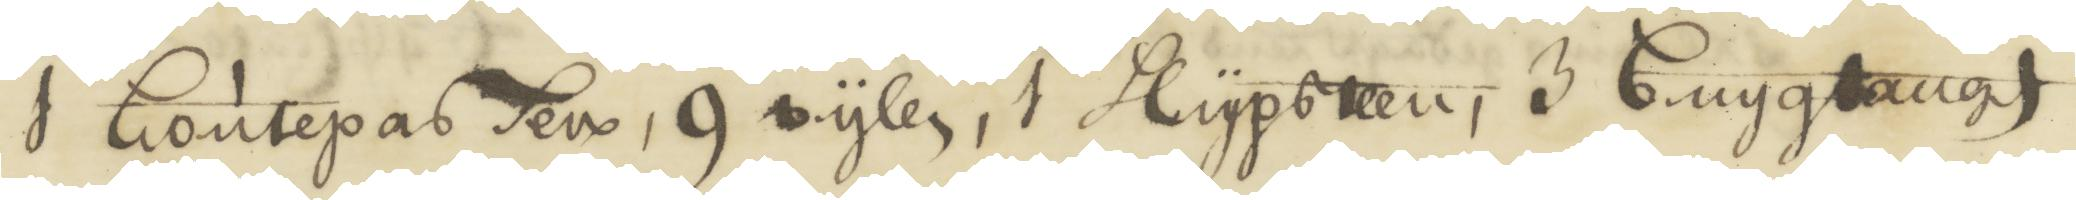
1 houtepasser, 9 vijlen, 1 slijpsteen, 3 buygtangen
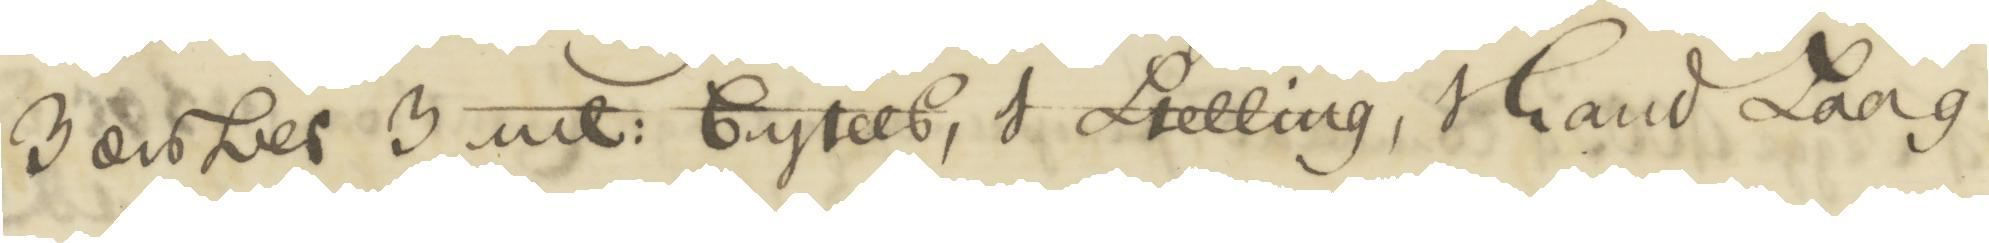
3 dissels 3 inl: bytels, 1 Stelling, 1 hand Zaag
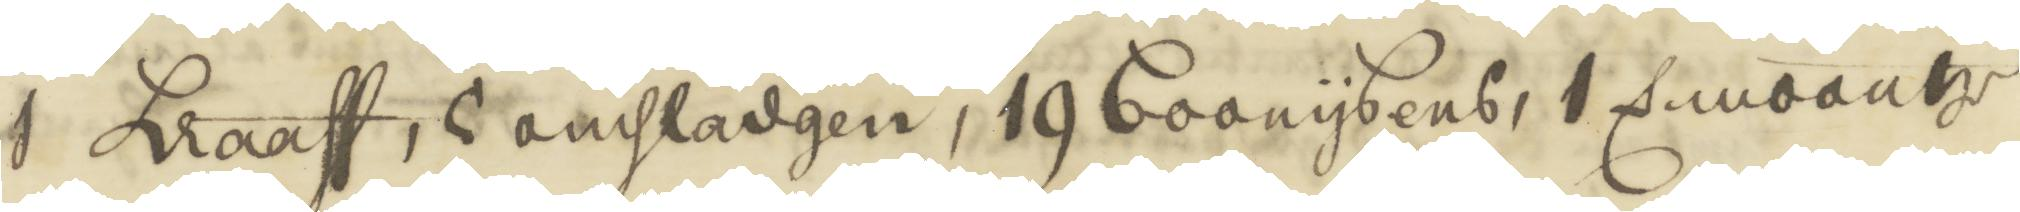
1 schaaff, 5 amslaegen, 19 boorijsers, 1 vermoortje
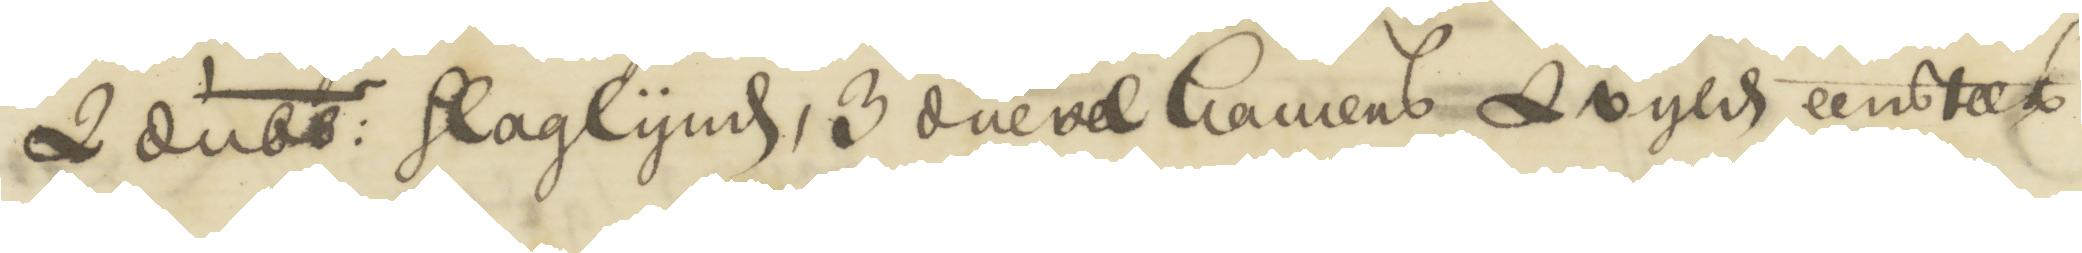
2 dubb: slaglijnen, 3 drevel kamers 2 vylen een steek
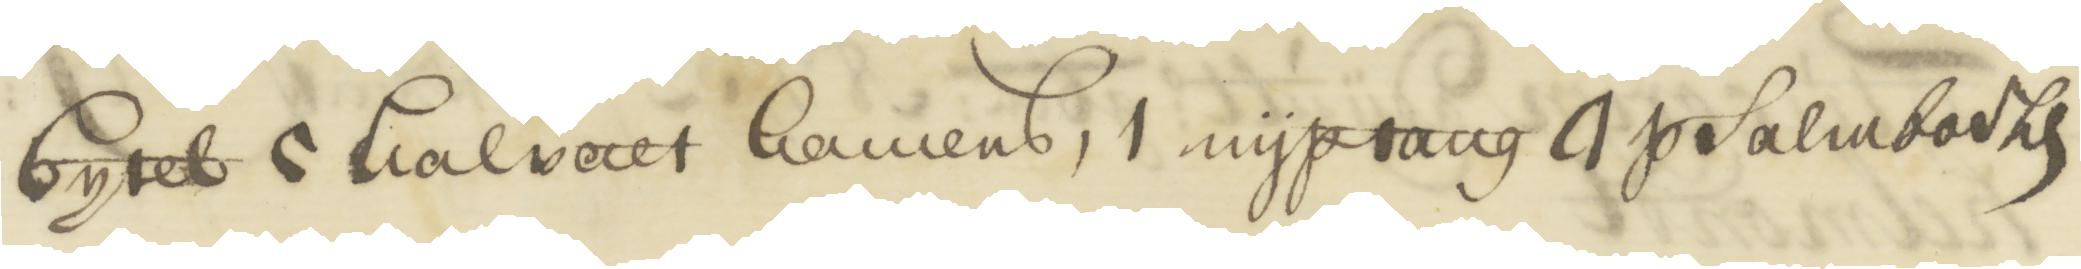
bytel 5 kalvoet hamers, 1 nijptang 4 psalmboeken
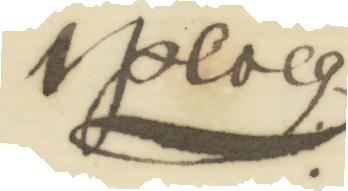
1 ploeg
